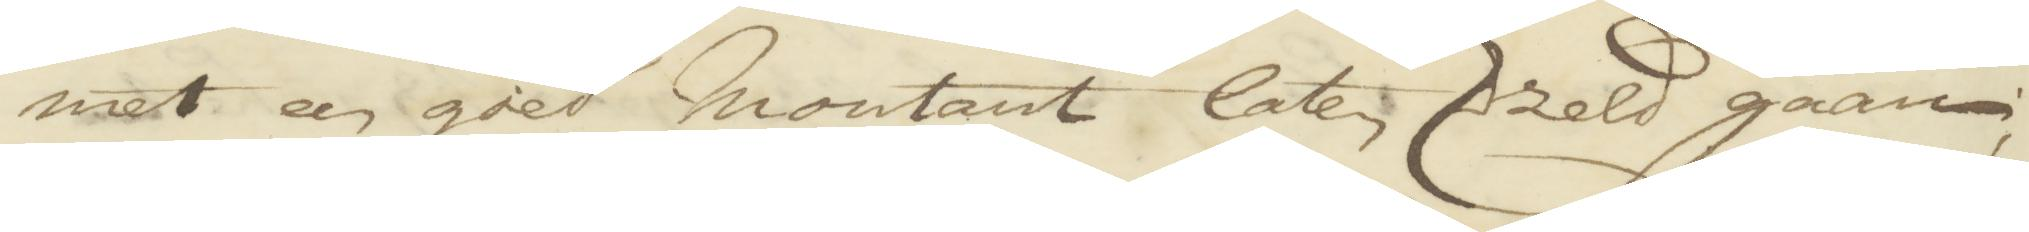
met een goed montant laten verzeld gaan;
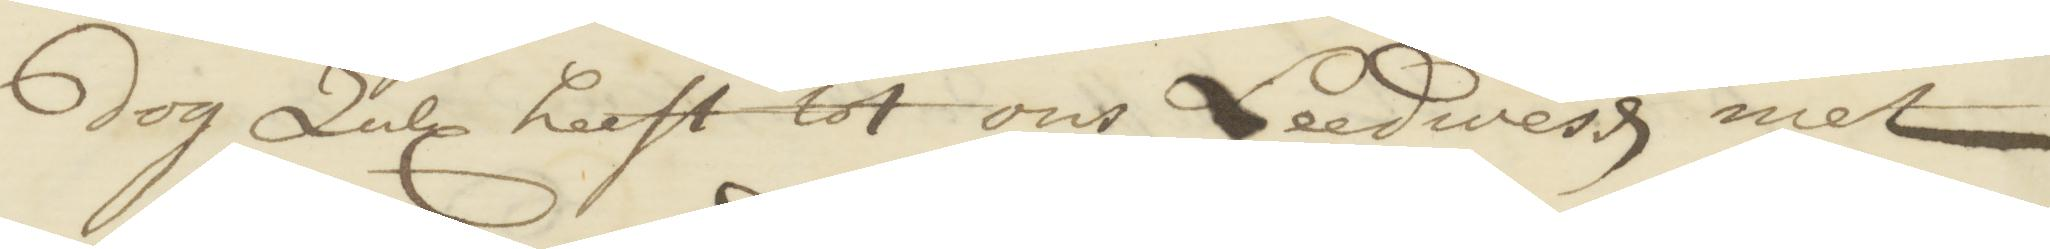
dog zulx heeft tot ons Leedwesen niet
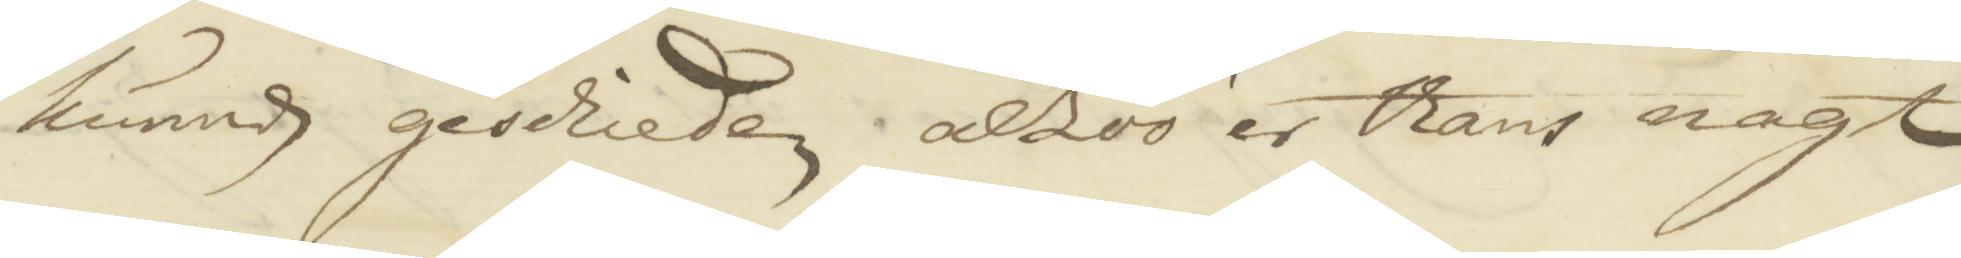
kunnen geschieden alzoo er thans nagt
